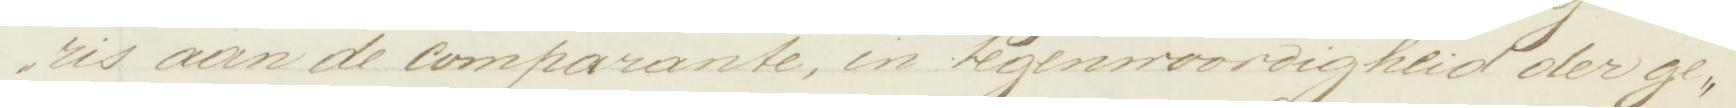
„ris aan de comparante, in tegenwoordigheid der ge„
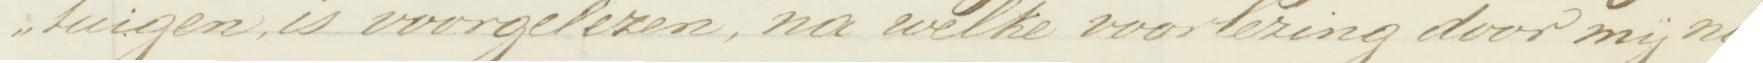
„tuigen, is voorgelezen, na welke voorlezing door mij no
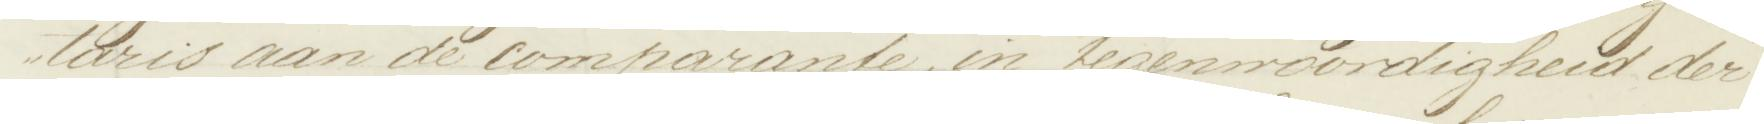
„taris aan de comparante, in tegenwoordigheid der
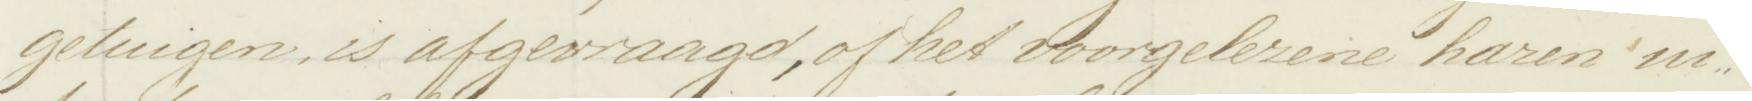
getuigen, is afgevraagd, of het voorgelezene haren ui„
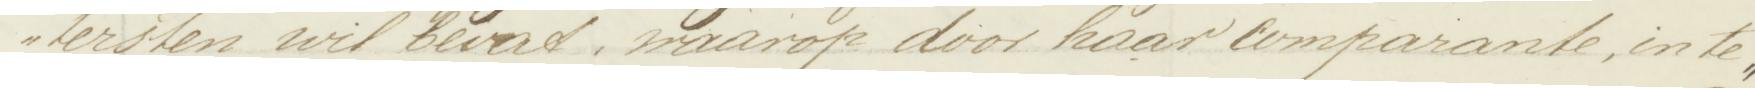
„tersten wil bevat, waarop door haar comparante, in te
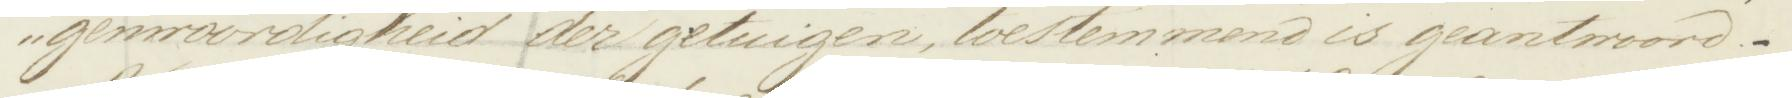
„genwoordigheid der getuigen, toestemmend is geantwoord. -
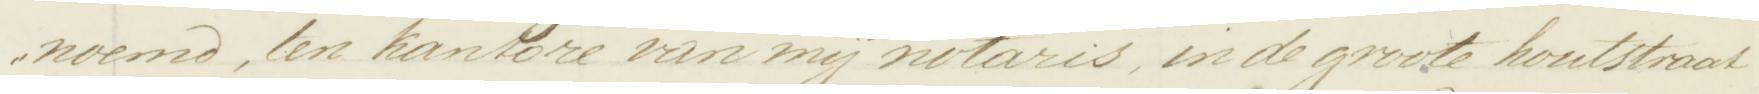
„noemd, ten kantore van mij notaris, in de groote houtstraat
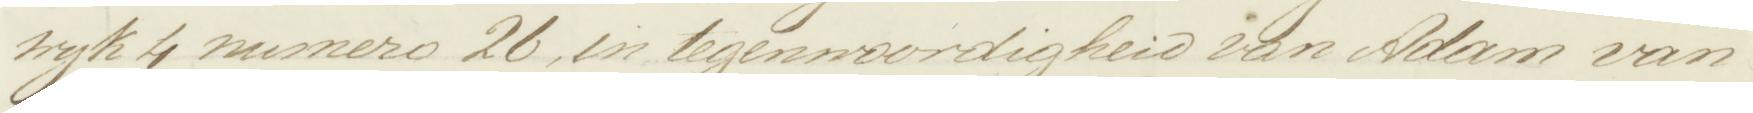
wyk 4 numero 26, in tegenwoordigheid van Adam van
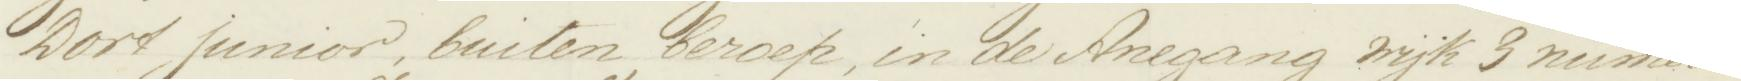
Dort junior, buiten beroep, in de Anegang wijk 3 numero
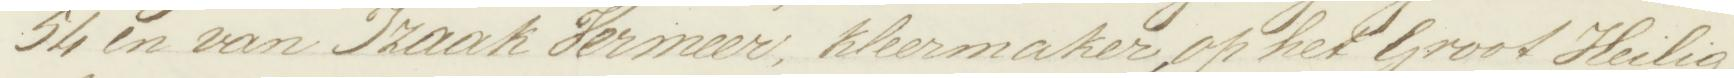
54 en van Izaak Vermeer, kleermaker, op het Groot Heilig
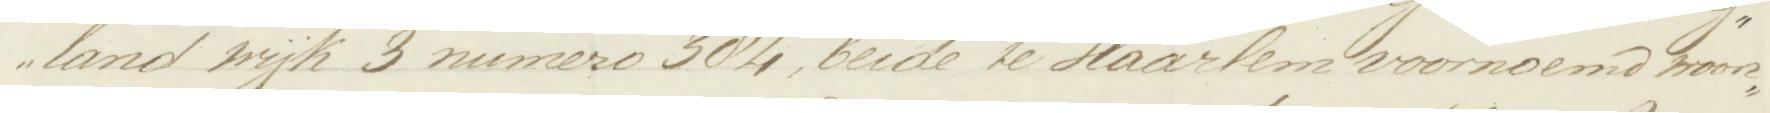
„land wijk 3 numero 384, beide te Haarlem voornoemd woon„
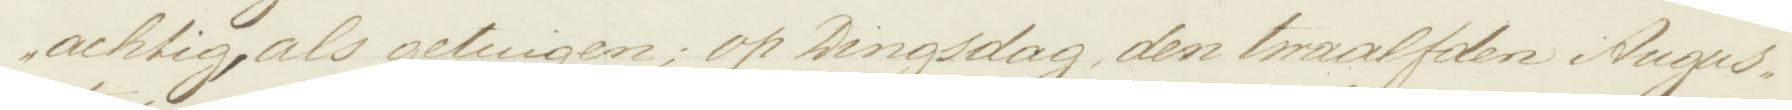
„achtig, als getuigen; op Dingsdag, den twaalfden Augus„
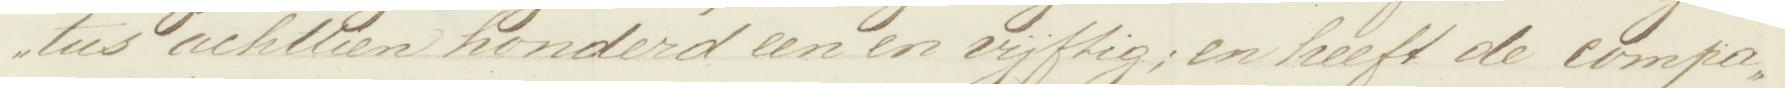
„tus achttien honderd een en vijftig; en heeft de Compa„
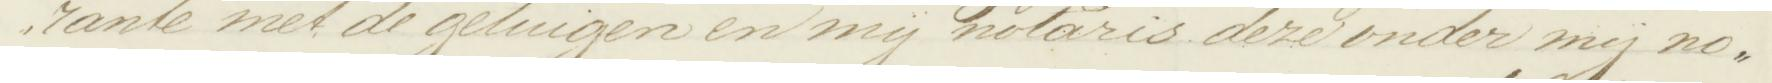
„rante met de getuigen en mij notaris deze onder mij no„
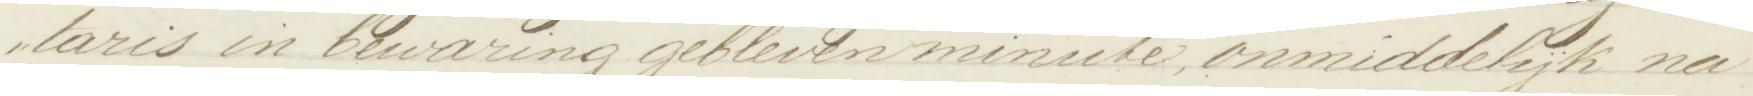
„taris in bewaring gebleven minute, onmiddelijk na
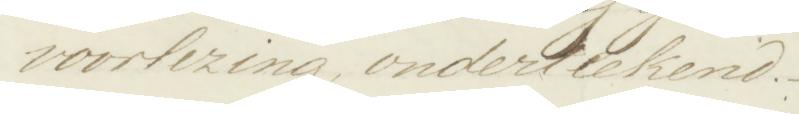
voorlezing, onderteekend.
